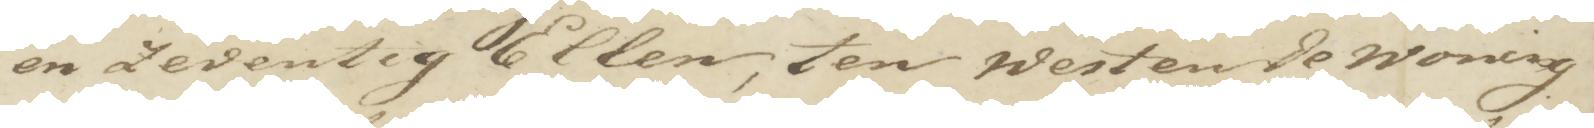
en zeventig Ellen, ten westen de woning.
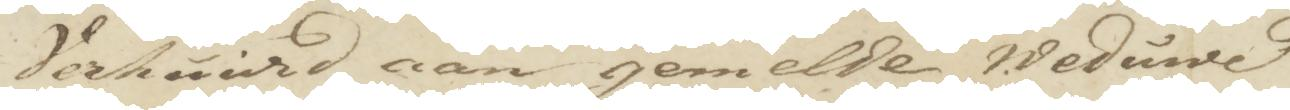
Verhuurd aan gemelde weduwe
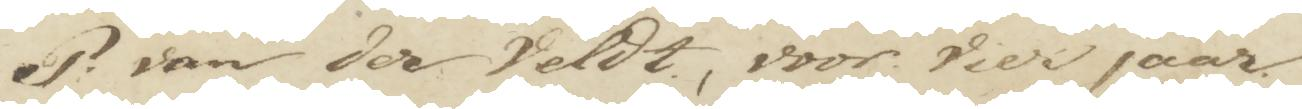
P: van der Veldt, voor vier jaar.
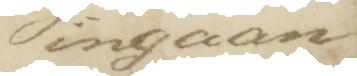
ingaan
